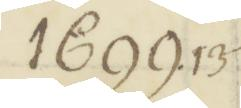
1699.13 3/5
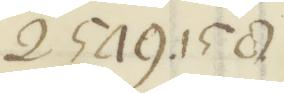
2549.15 8.
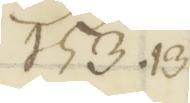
153.13 1/3
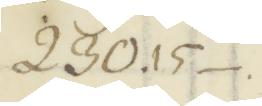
230.15—
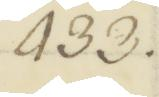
433.
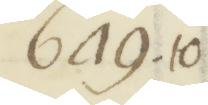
649.10
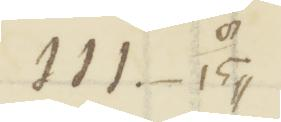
111. — 8/15„
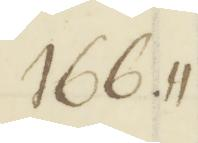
166.11
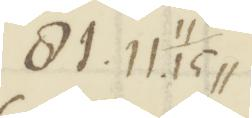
81.11.11/15„
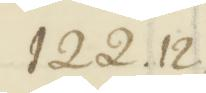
122.12
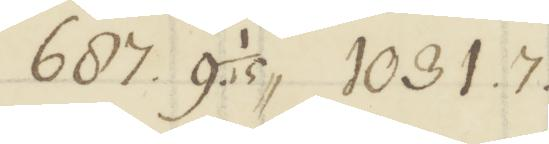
687.9.1/15„ 1031.7
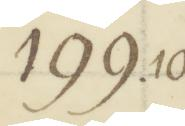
199.10 2/15
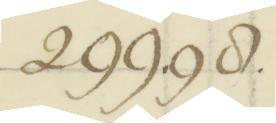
299.98.
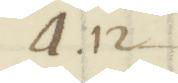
4.12
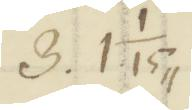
3.1.1/15„
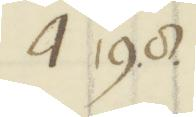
4 19.8.
